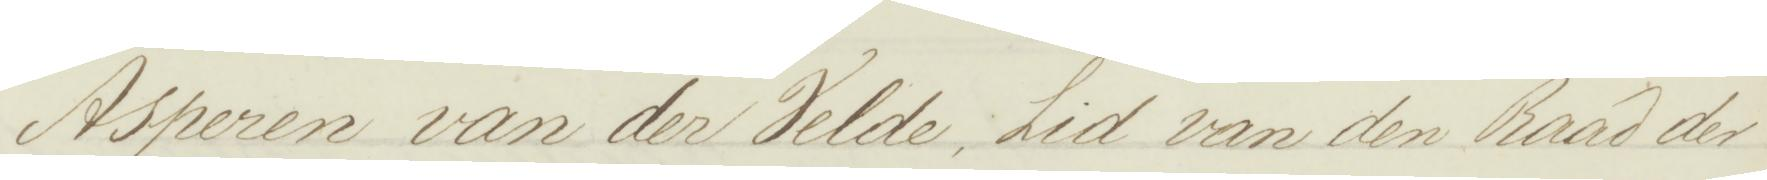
Asperen van der Velde, Lid van den Raad der
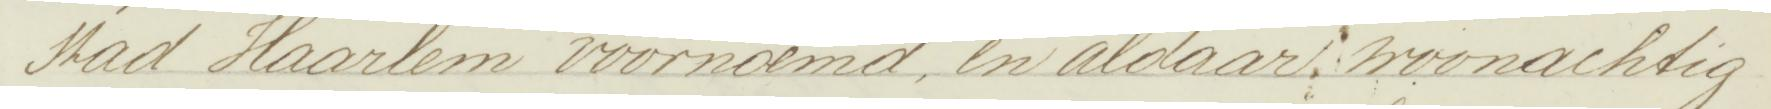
stad Haarlem voornoemd, en aldaar woonachtig
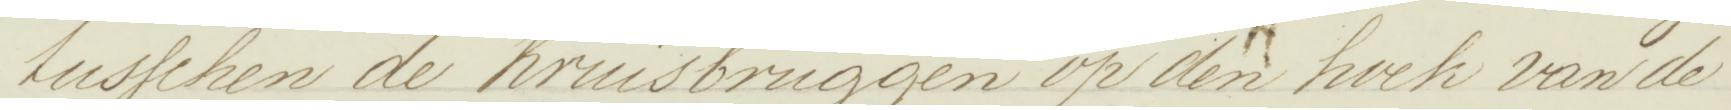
tusschen de Kruisbruggen op den hoek van de
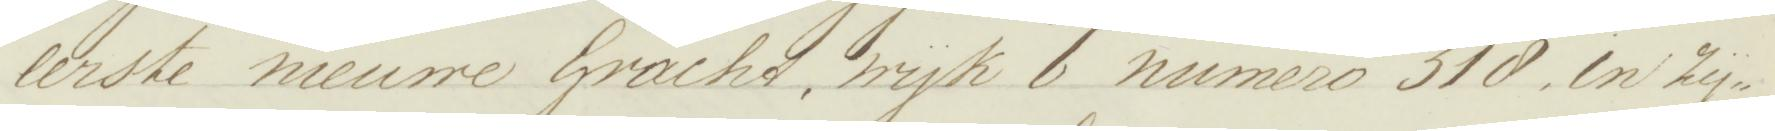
eerste nieuwe Gracht, wijk 6 numero 318, in zij„
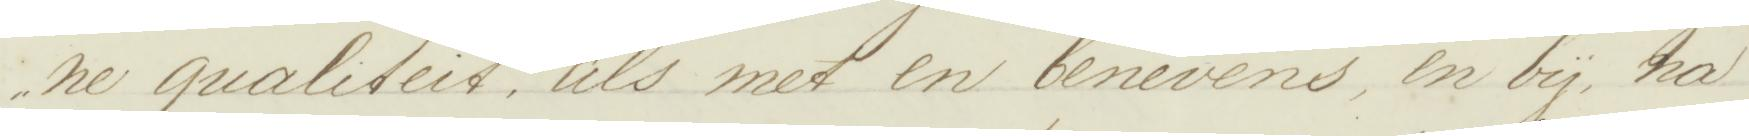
„ne qualiteit, als met en benevens, en bij, na
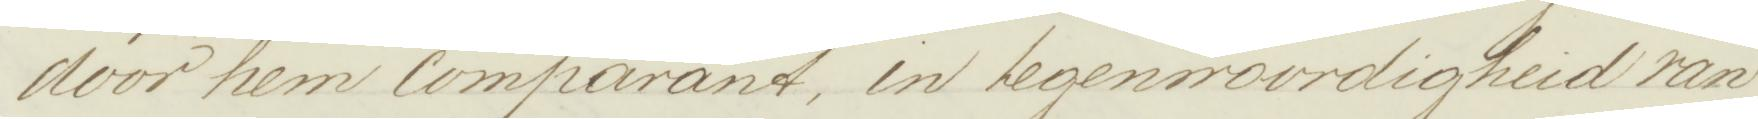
door hem Comparant, in tegenwoordigheid van
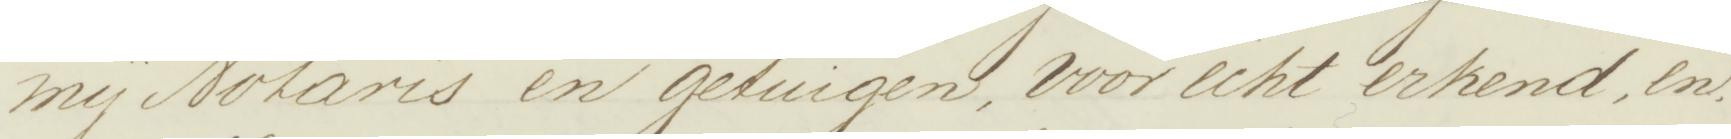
mij Notaris en getuigen, voor echt erkend, en
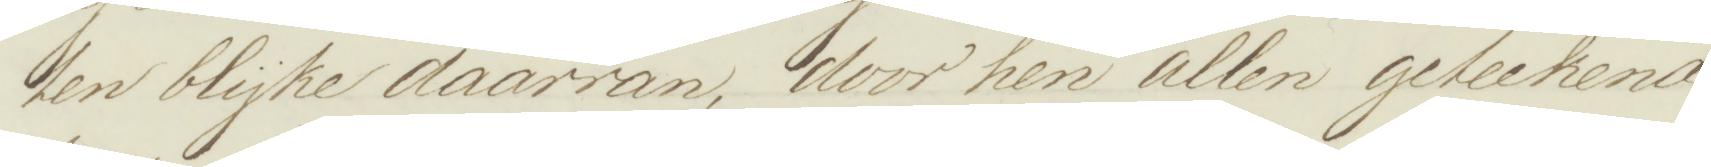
ten blijke daarvan, door hen allen geteekend
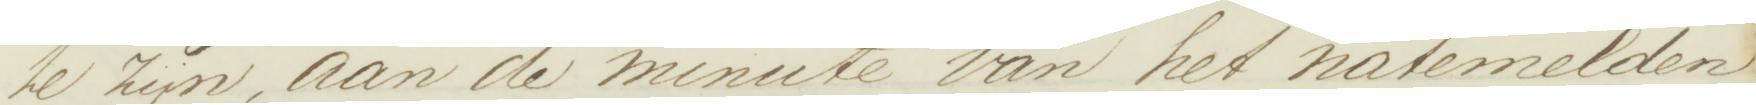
te zijn, aan de minute van het natemelden
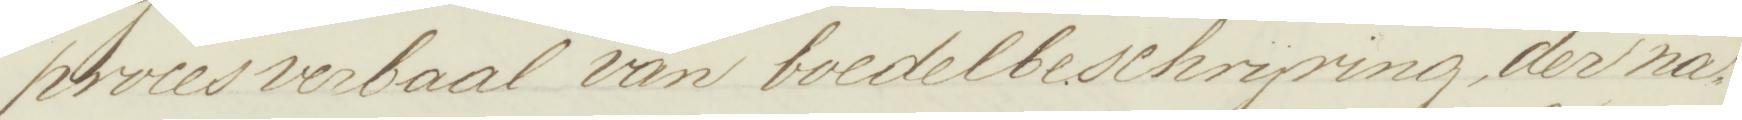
proces verbaal van boedelbeschrijving, der na„
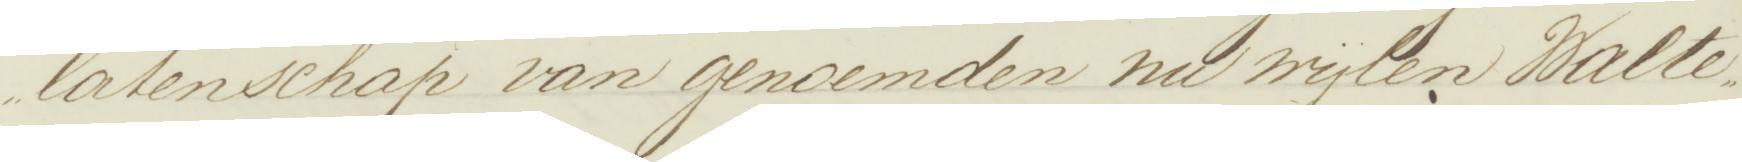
„latenschap van genoemden nu wijlen Walte„
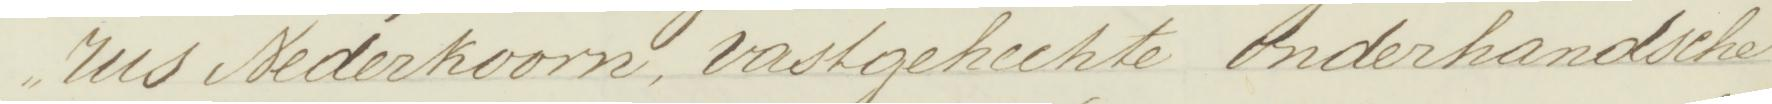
„rus Nederkoorn, vastgehechte onderhandsche
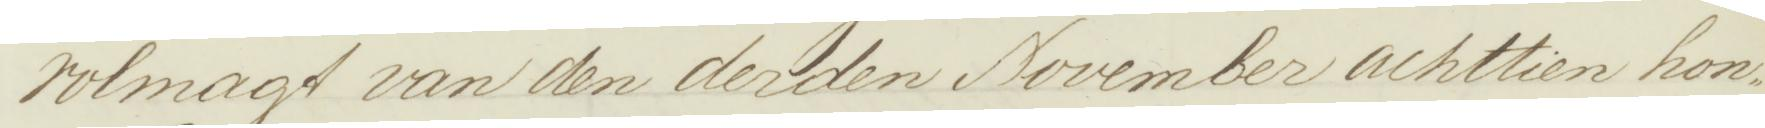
volmagt van den derden November achttien hon
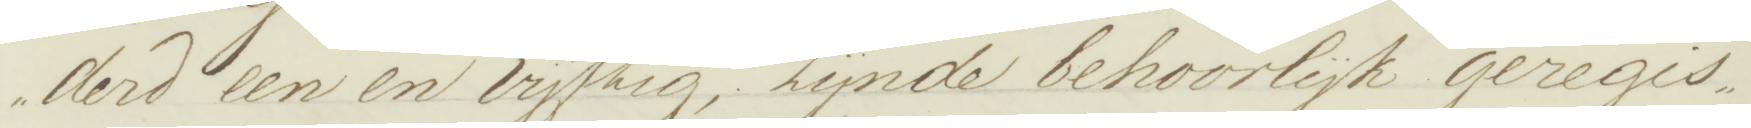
„derd een en vijftig, zijnde behoorlijk geregis„
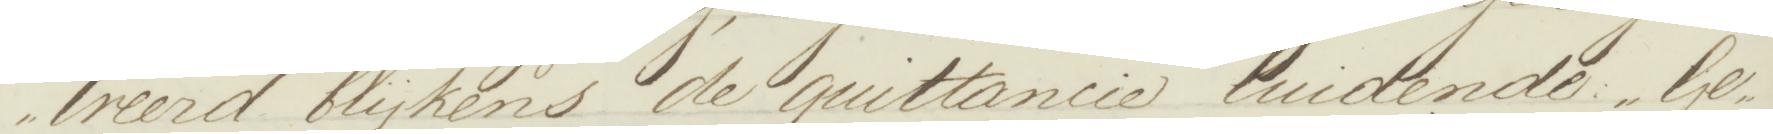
„treerd blijkens de quittancie luidende: „ Ge„
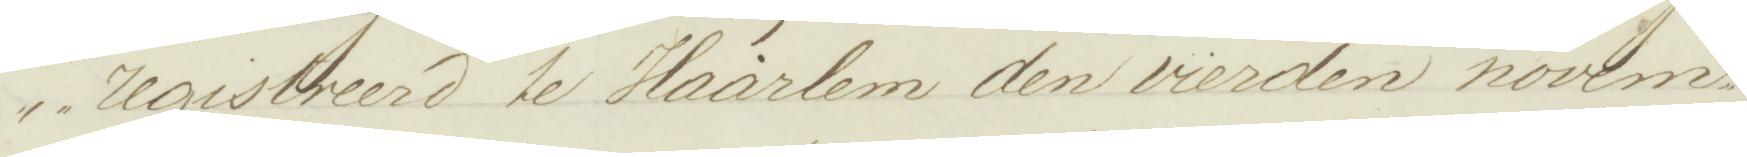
„ „registreerd te Haarlem den vierden novem„
